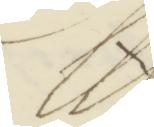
C G
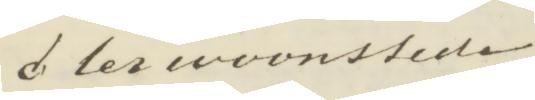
ter woonstede
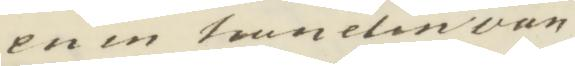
en in handen van
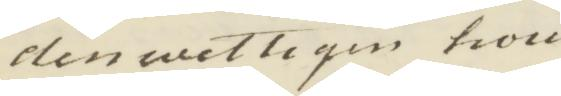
den wettigen hou
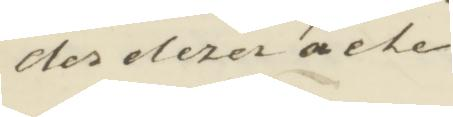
der dezer acte
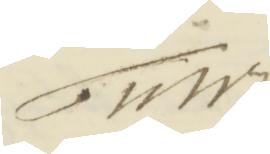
FrWJr
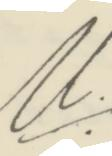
U:
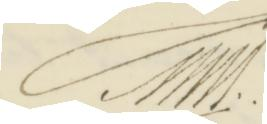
AWH
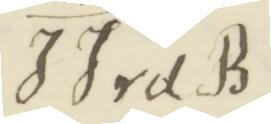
JJvdB
